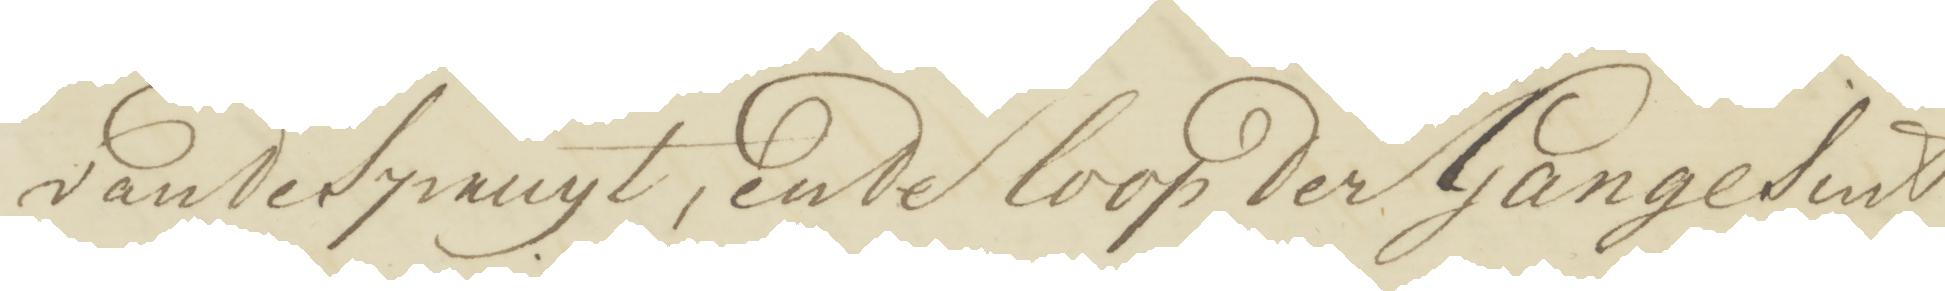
van de Spruijt, en de loop der Ganges uit
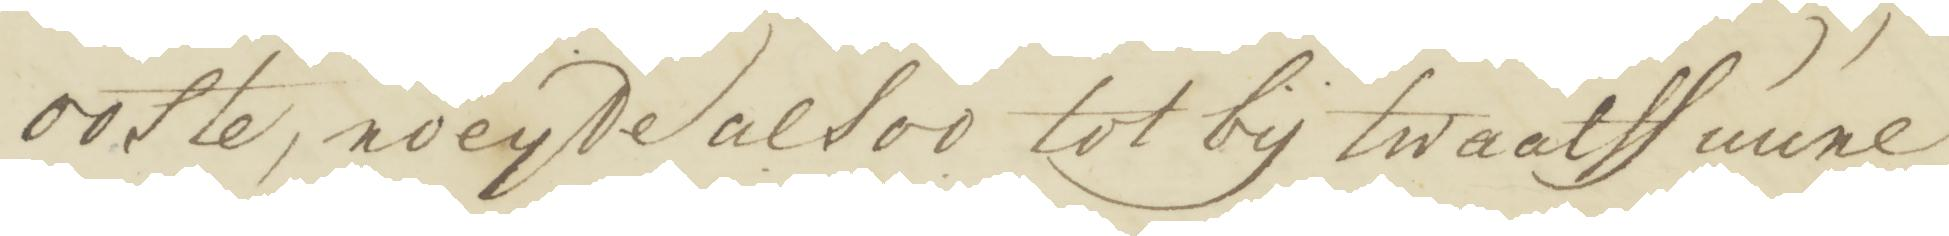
ooste, roeijde alsoo tot bij twaalff uure
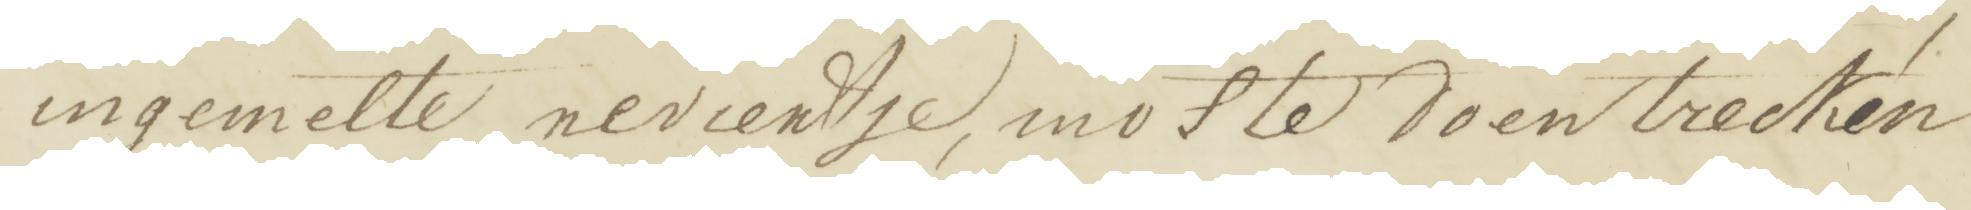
in gemelte reviertje, moste doen trecken
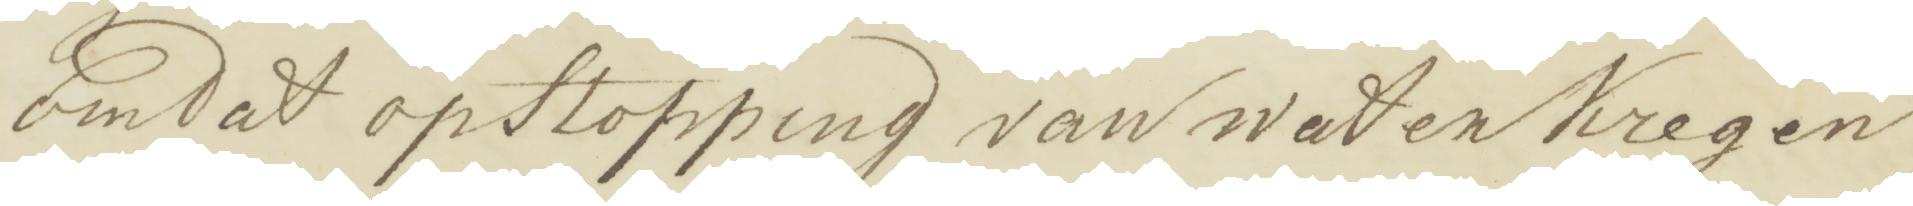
omdat opstopping van water Kregen
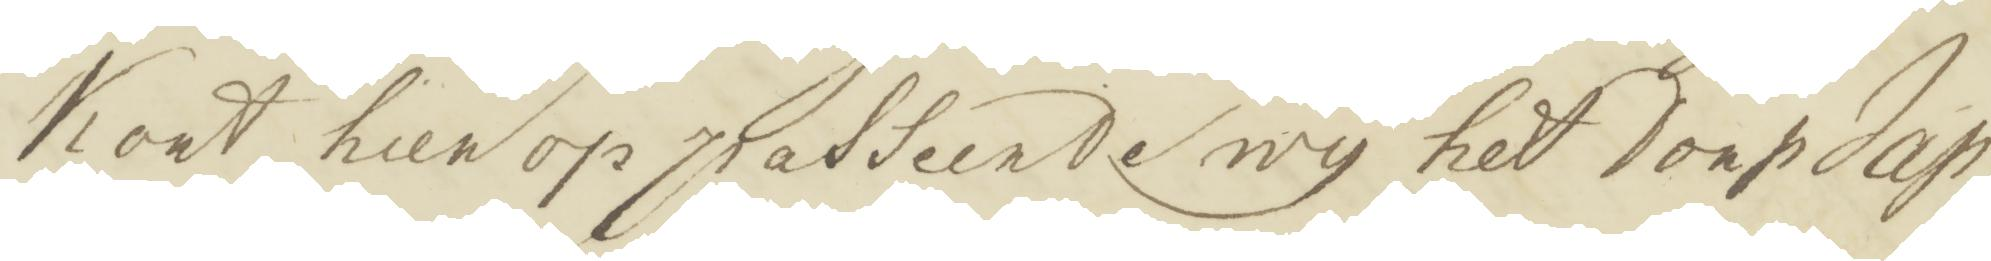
kort hier op passeerde wij het dorp Iap
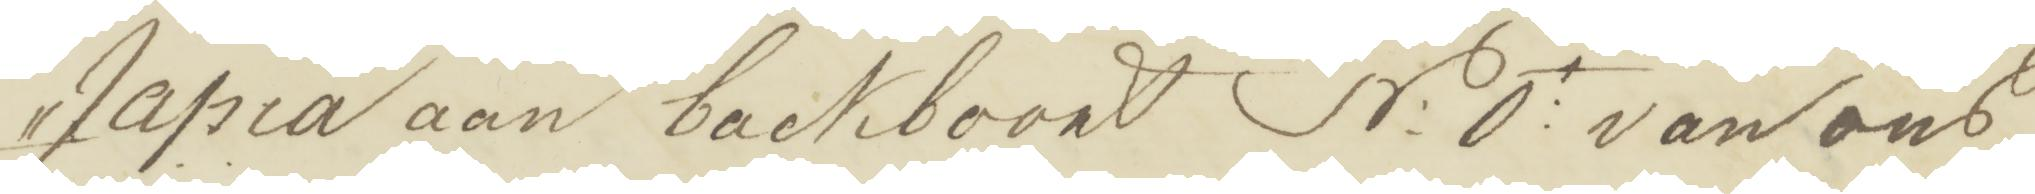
„Japia aan backboort N: O:t van ons
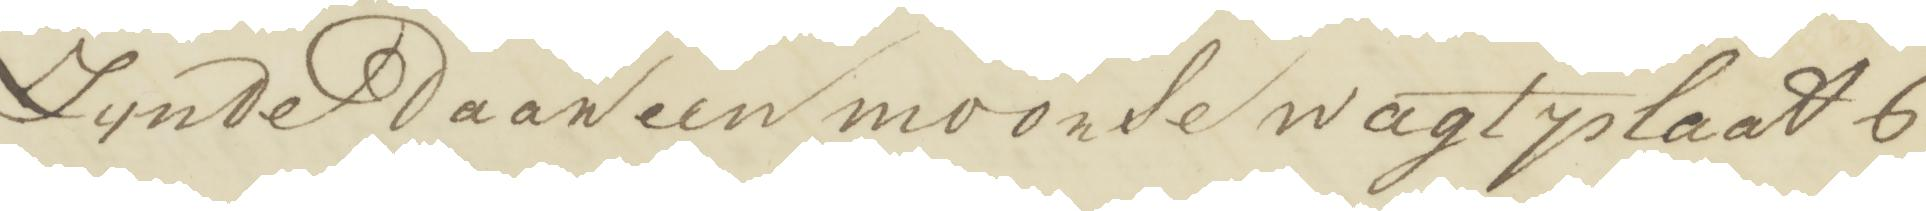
Zijnde daar een moorse wagtplaats
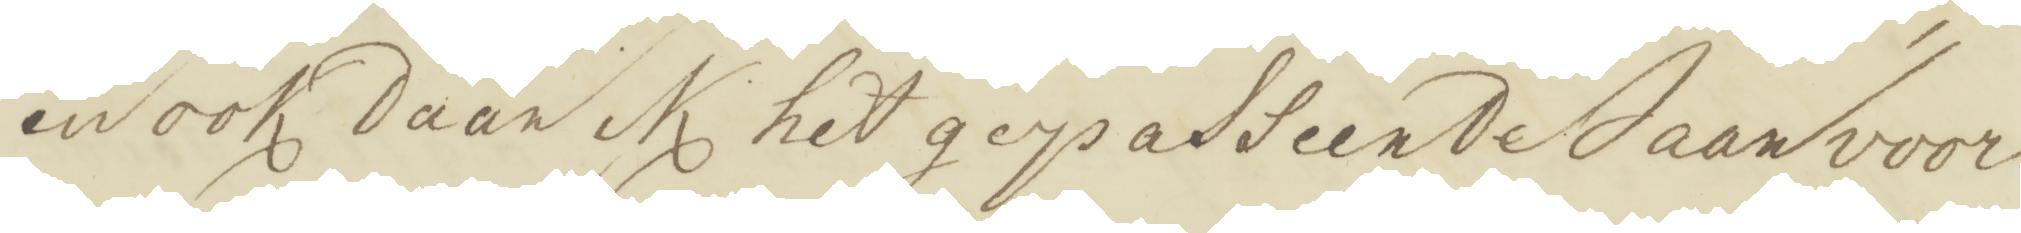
en ook daar ik het gepasseerde Iaar voor
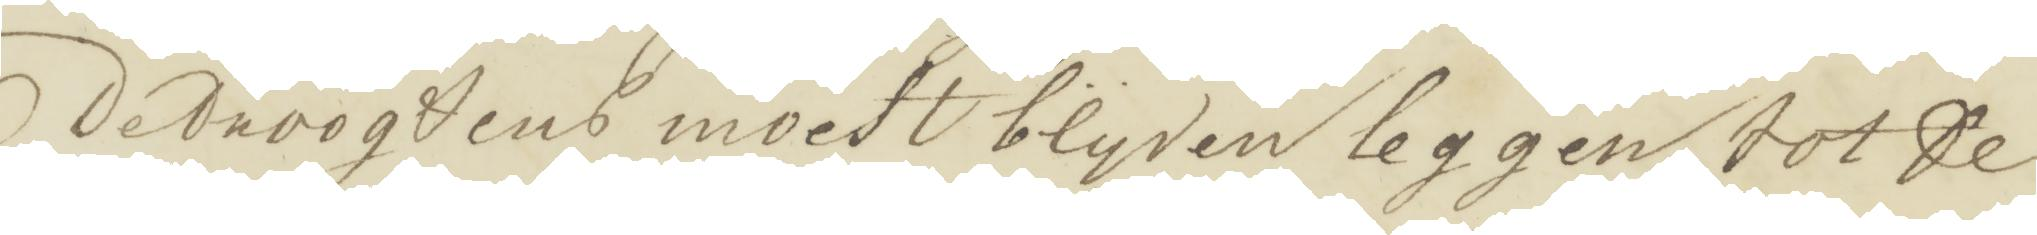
de droogtens moest blijven leggen tot de
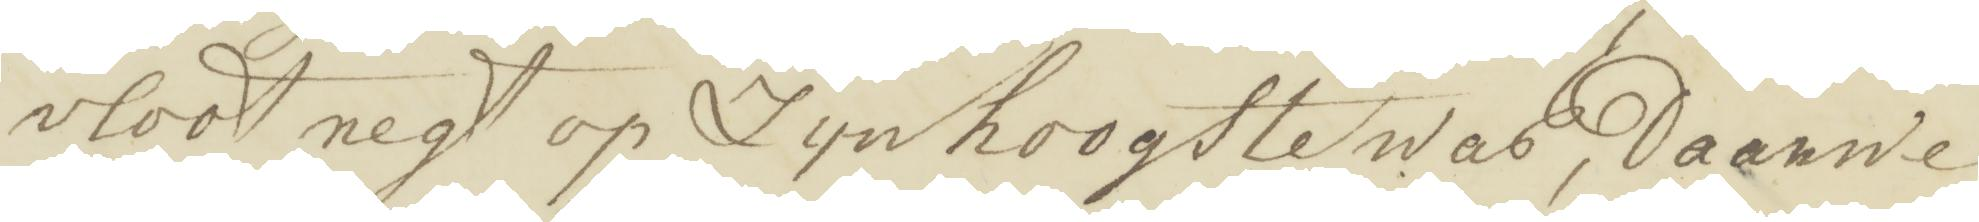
vloot regt op Zijn hoogste was, daar we
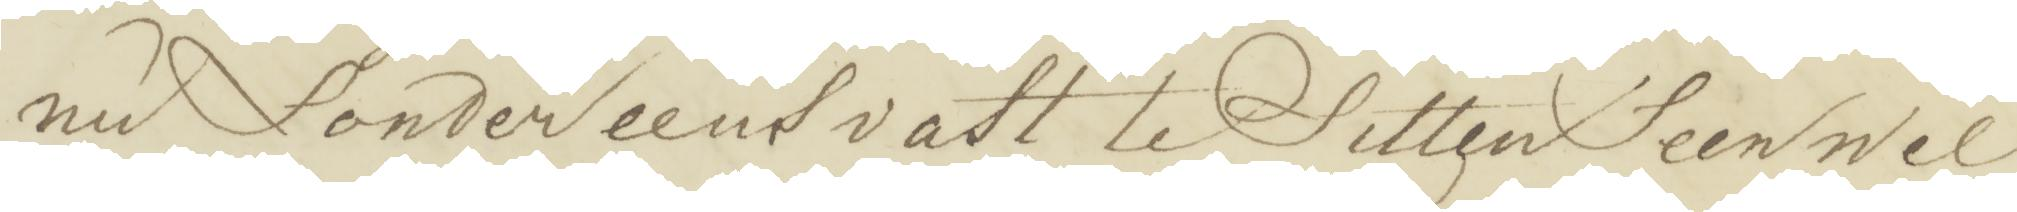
nu Sonder eens vast te Sitten Seer wel
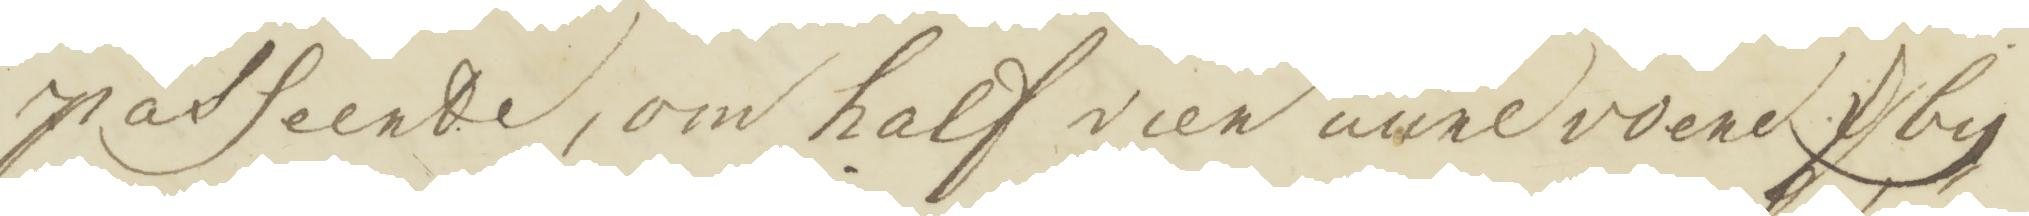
passeerde, om half vier uure voere verbij
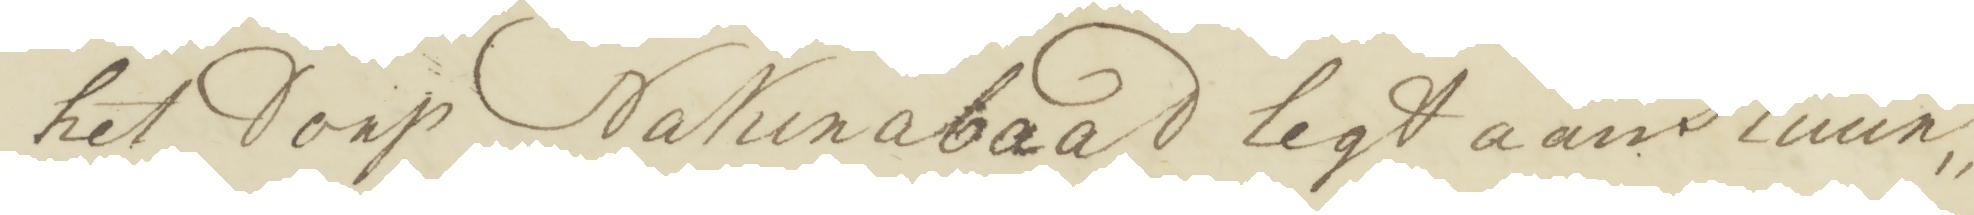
het Dorp Nakurabaad legt aanstuur„
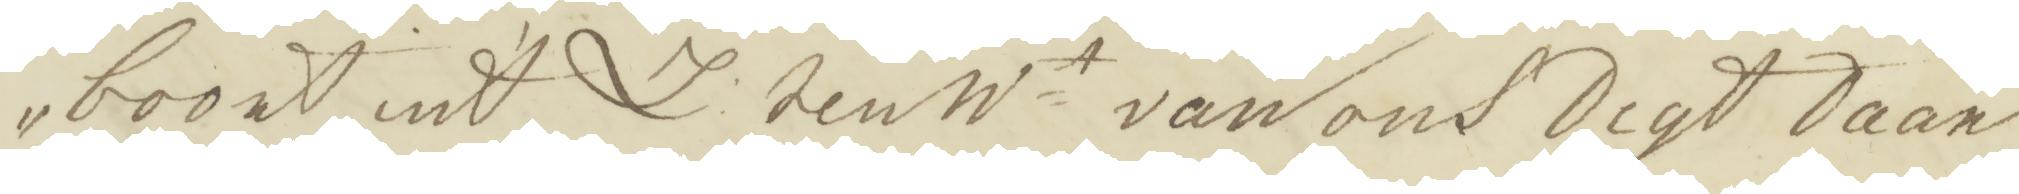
„boort in't Z: ten W:t van ons Digt Daar
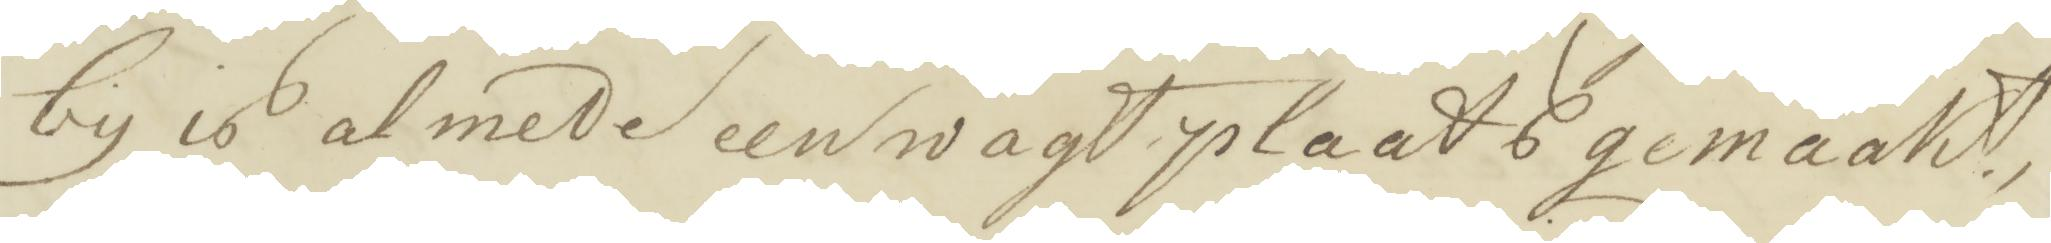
bij is almede een wagtplaats gemaakt,
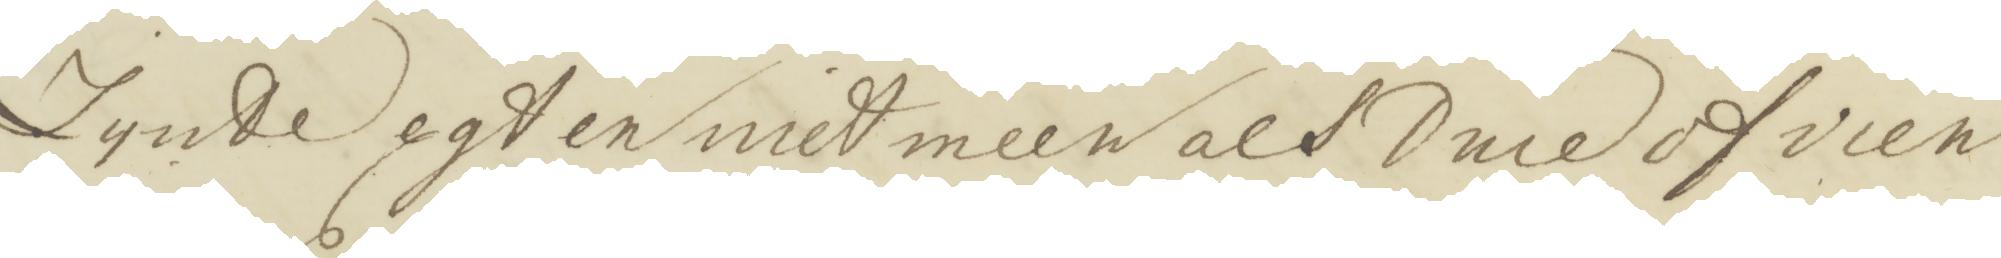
Zijnde egter niet meer als Drie of vier
